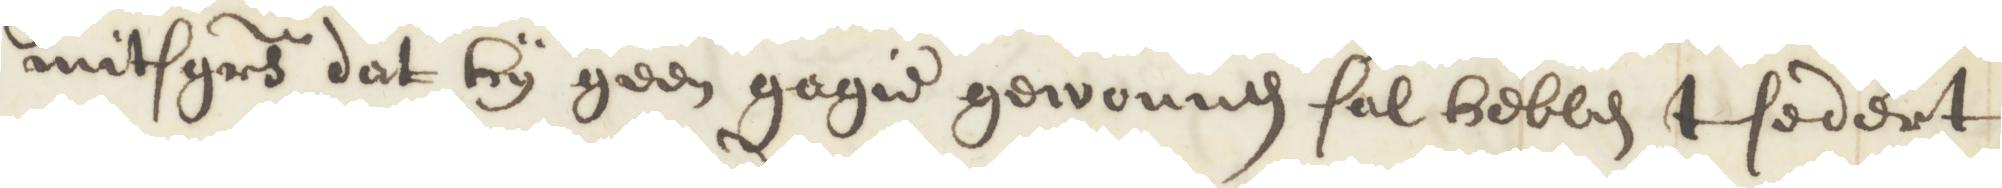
mitsgrs dat hij geen gagie gewonnen sal hebben t sedert
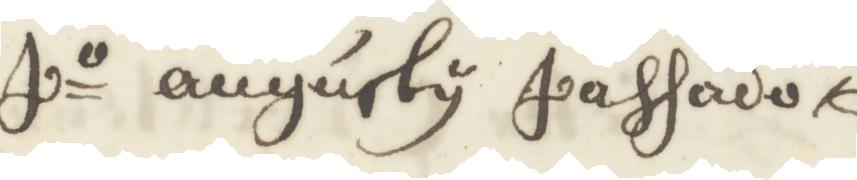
p=o augustij passado/
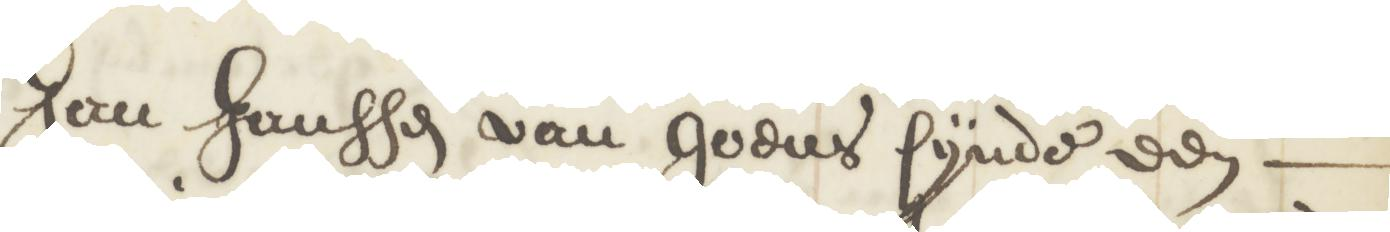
Jan Janssen van goens sijnde een —
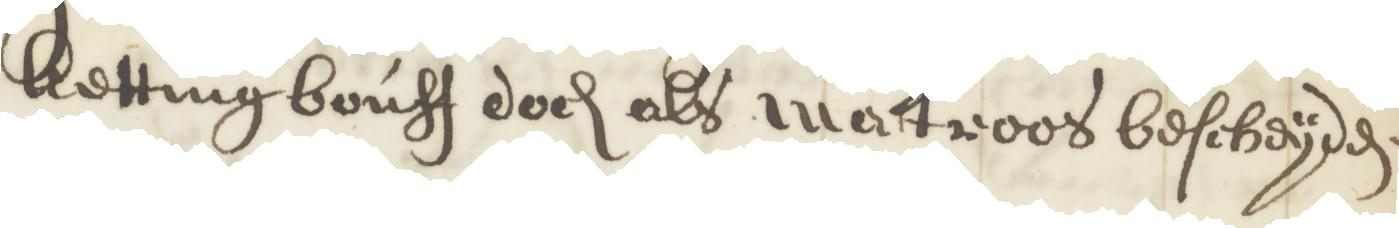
ketting bouff doch als matroos bescheijden
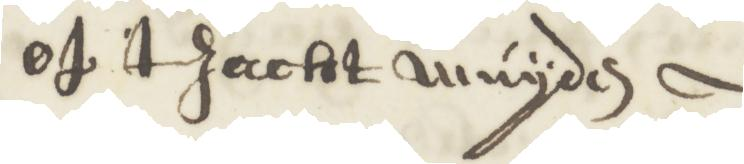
op 't Jacht muijden—
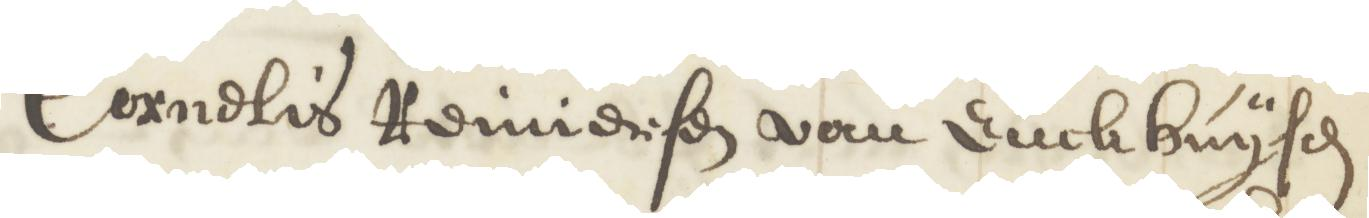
Cornelis Reiniersen van Enckhuijsen
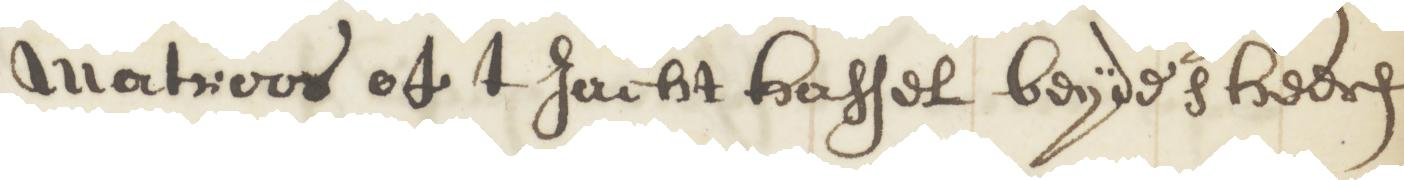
matroos op ’t Jacht hassel beijdes heeren
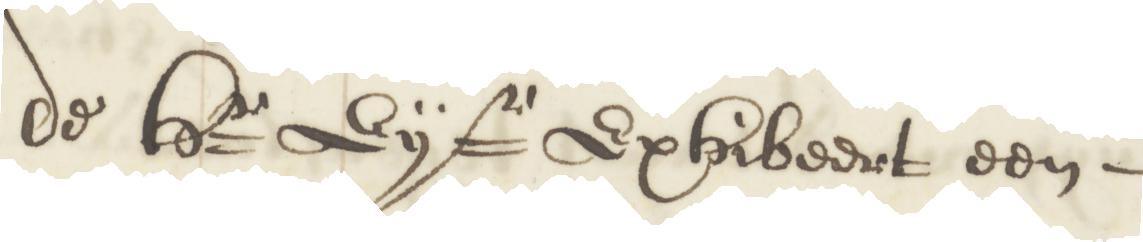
de H=r Eij=r Exhibeert een —
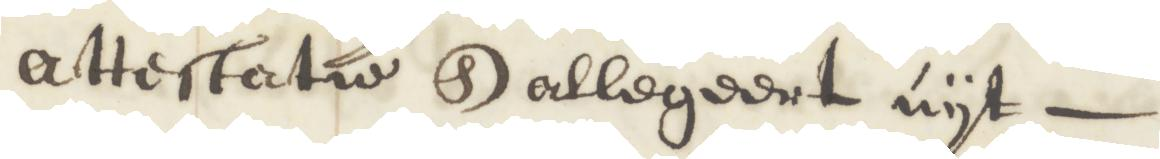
attestatie ende allegeert uijt —
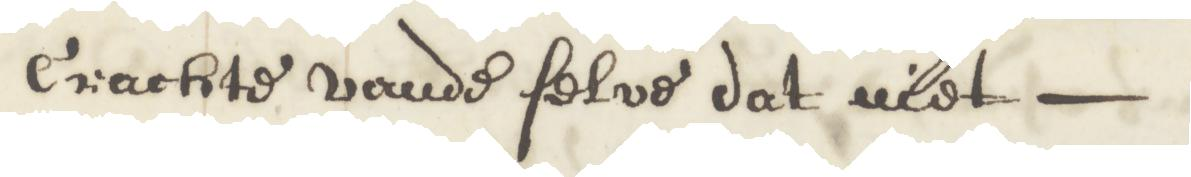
Crachte vande selve dat niet —
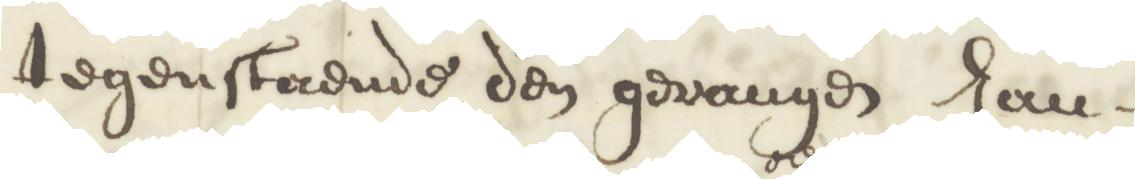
tegenstaende den gevangen Jan
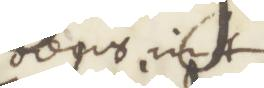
eens int
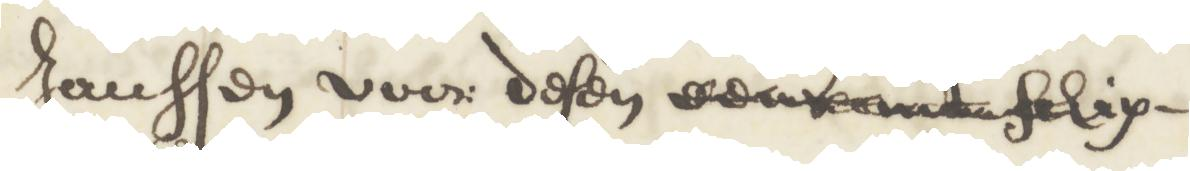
Janssen voor desen eensaant schip —
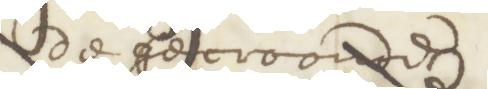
de gecroonde
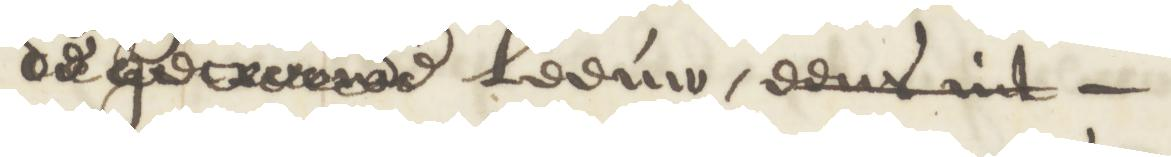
de gecroonde leeuw, eens int —
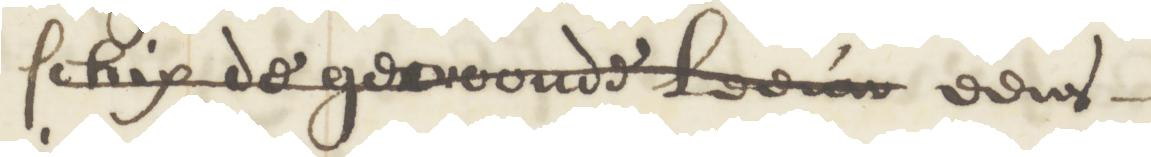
schip de gecroonde leeuw eens —
